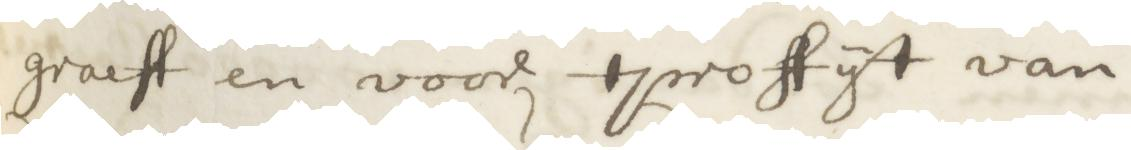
graeff en voor tproffijt van
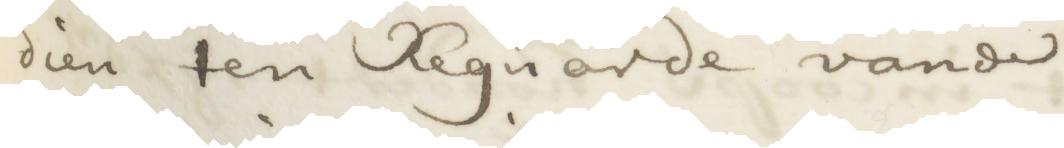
dien ten Reguarde van de
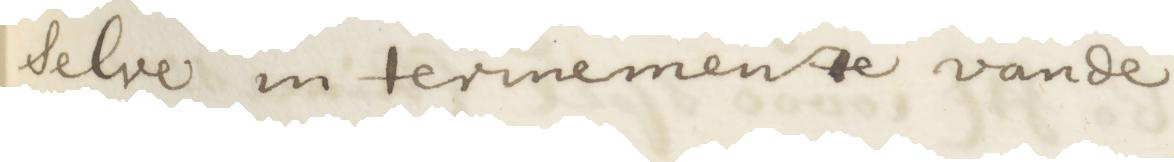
selve in terinemente vande
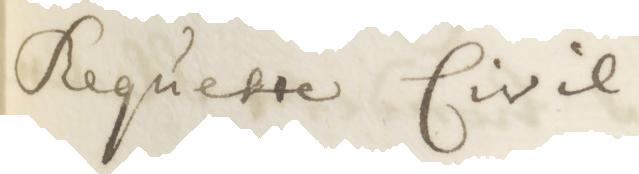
Requeste Civil
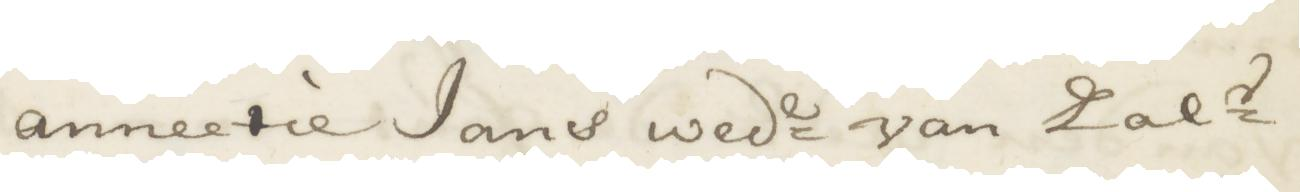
anneetie Ians wed=e van zal=s
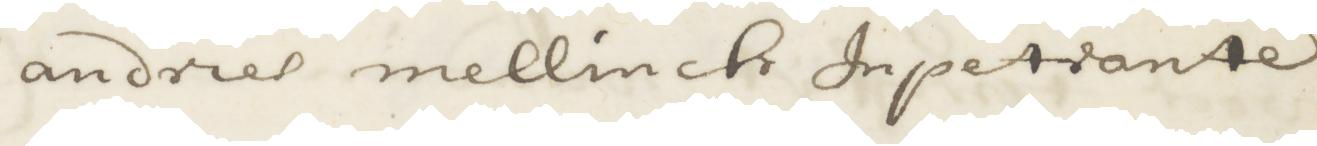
andrie mellinck Inpetrante
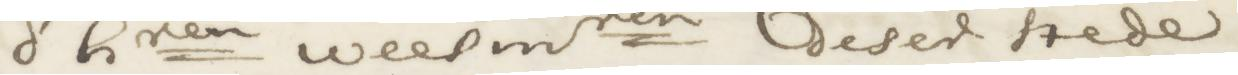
d’ H=ren weesm=ren deser stede
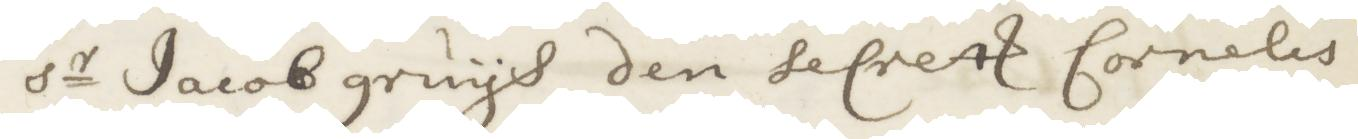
s=r Iacob gruijs den secret Cornelis
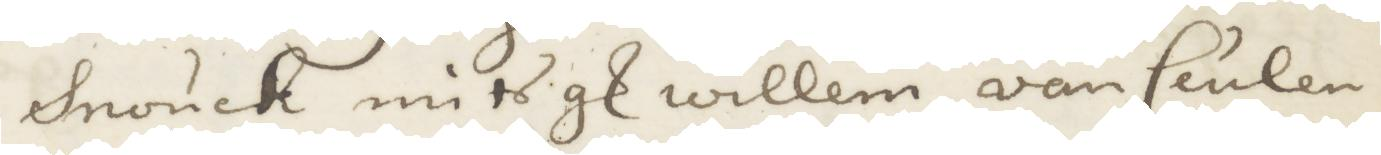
Snouck mitsg willem van Ceulen
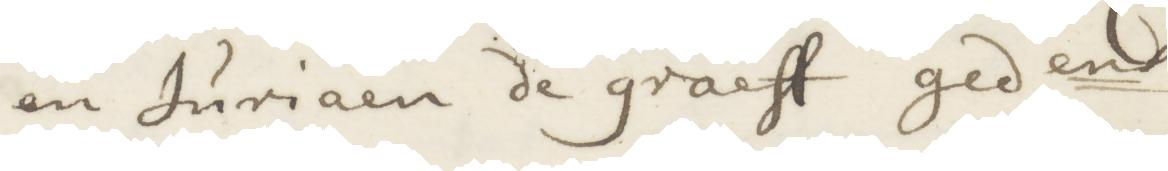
en Juriaen de graeff ged=ens
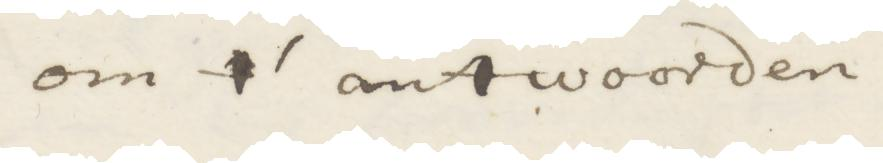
om t' antwoorden
